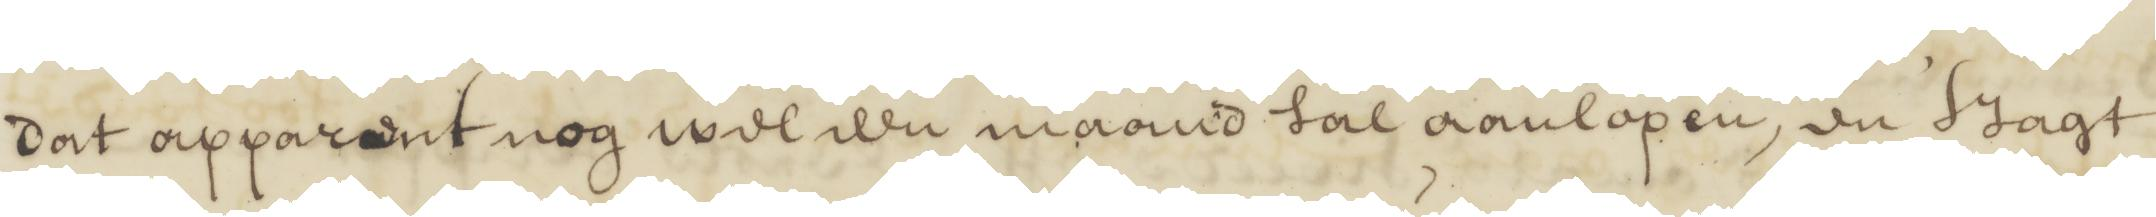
dat apparent nog wel een maand sal aanlopen, en 'tJagt
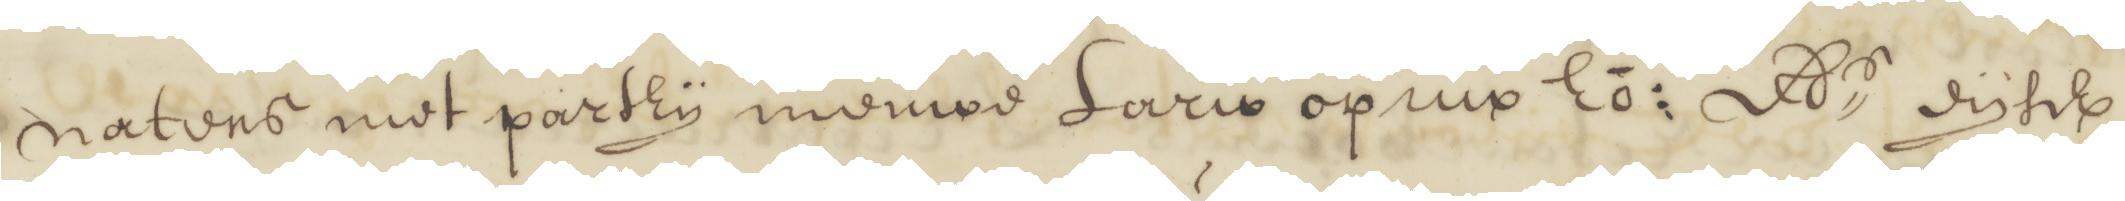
naters met parthij nieuwe tarw op uw ho: Ed„s eijsch
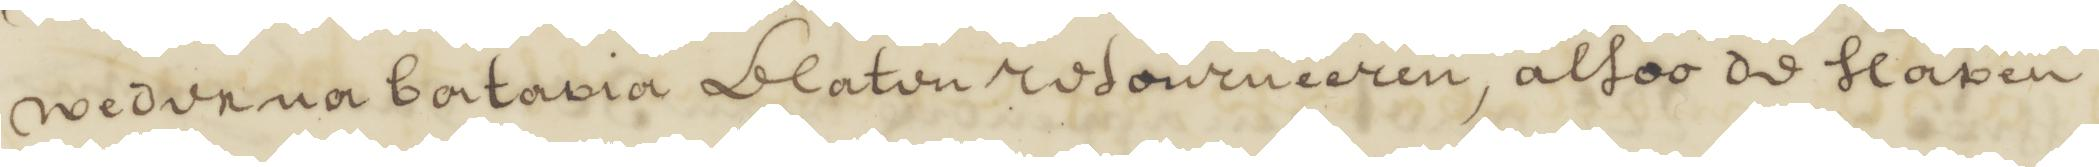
weder na batavia telaten retourneeren, alsoo de slaven
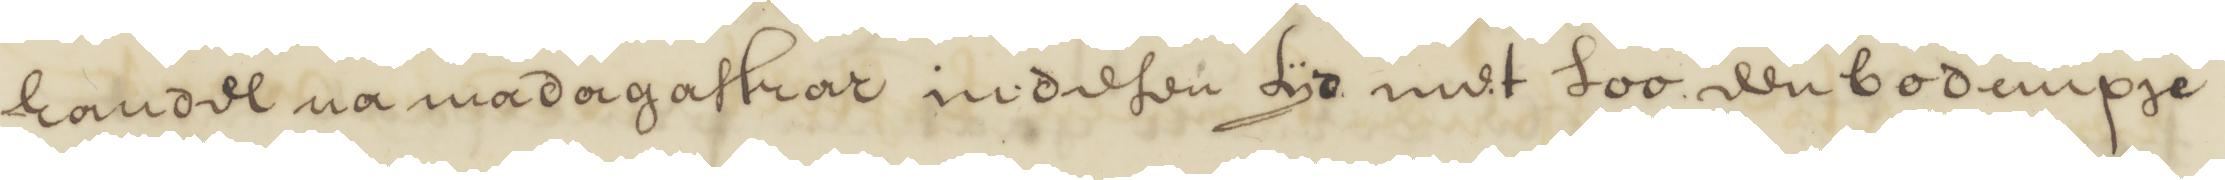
handel na madagaskar in desen tijd met soo een bodempje
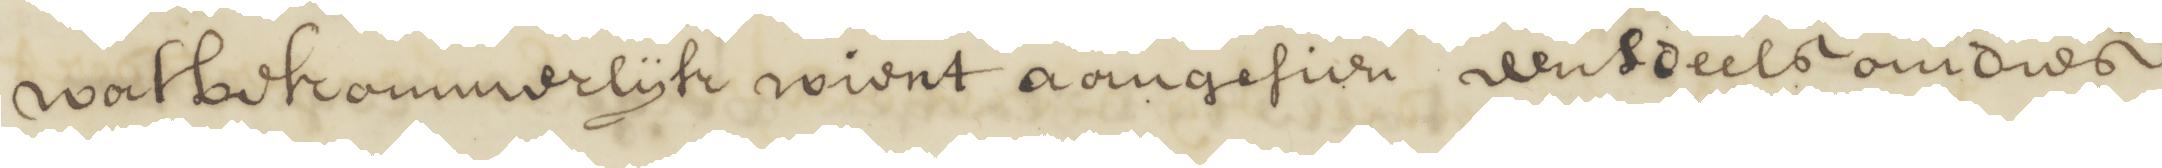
wat bekommerlijk wiert aangesien eensdeels om dies
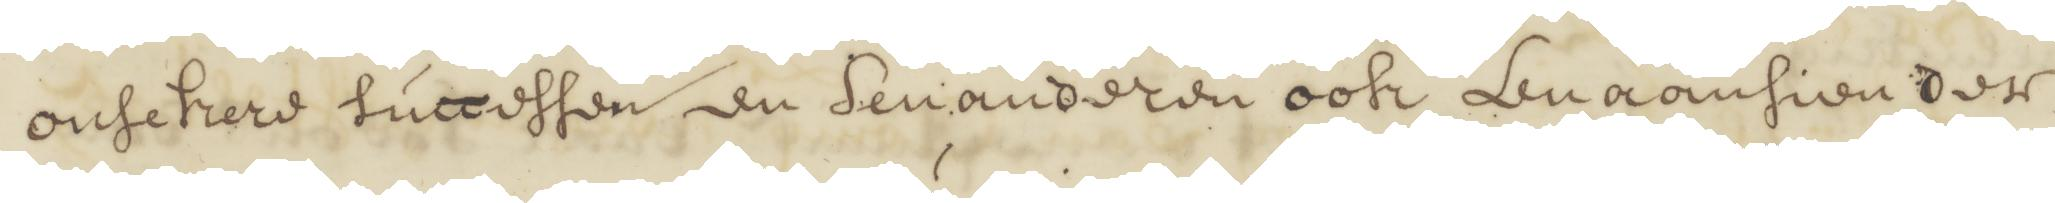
onsekere successen en ten anderen ook ten aansien der
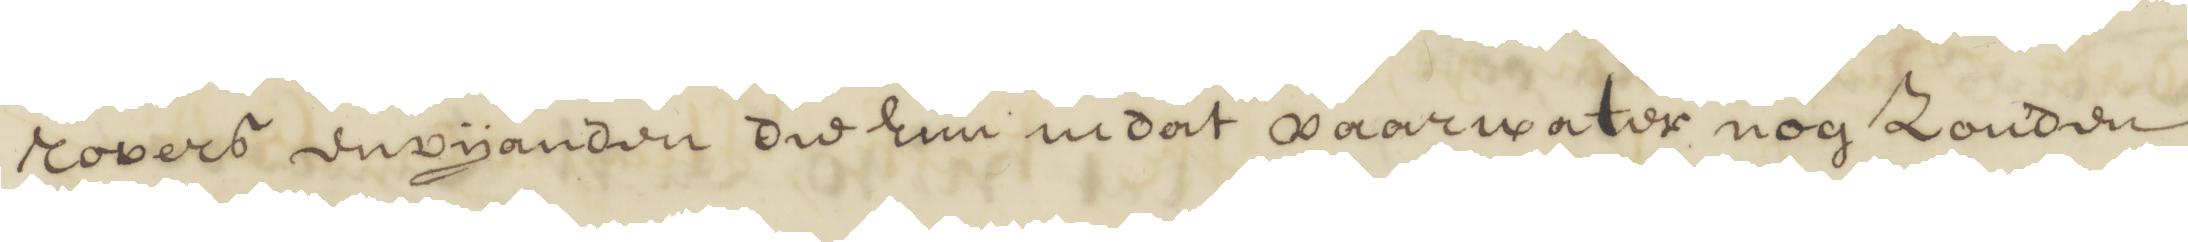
rovers en vijanden die hun in dat vaarwater nog zouden
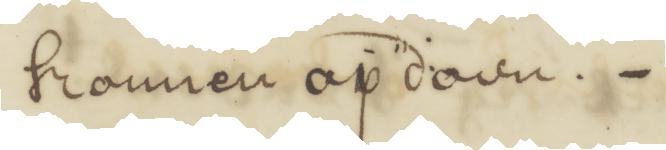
konnen op doen. —
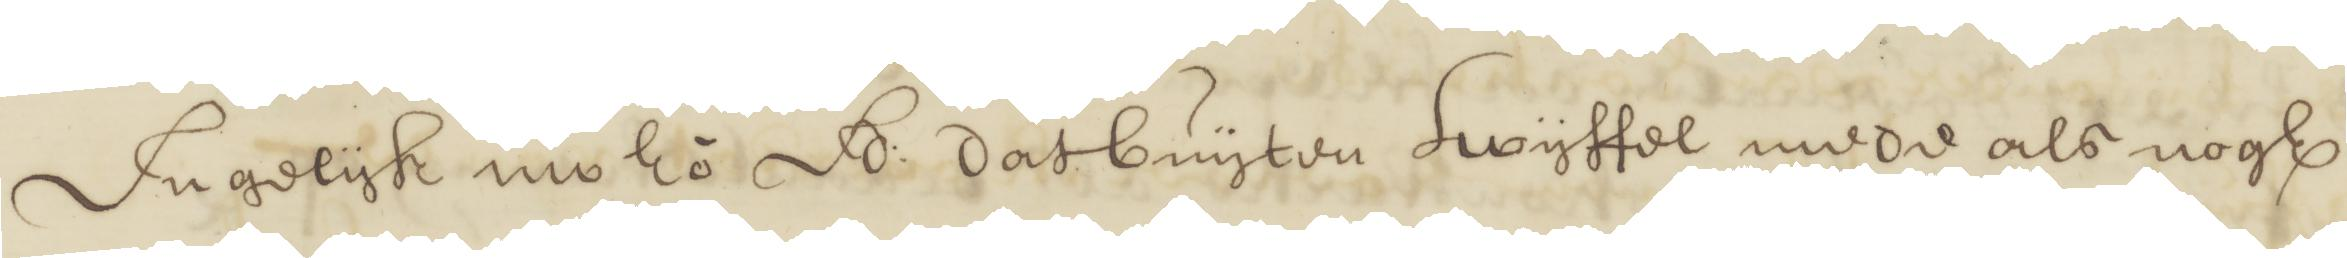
En gelijk uw ho Ed: dat buijten twijffel mede als nogh
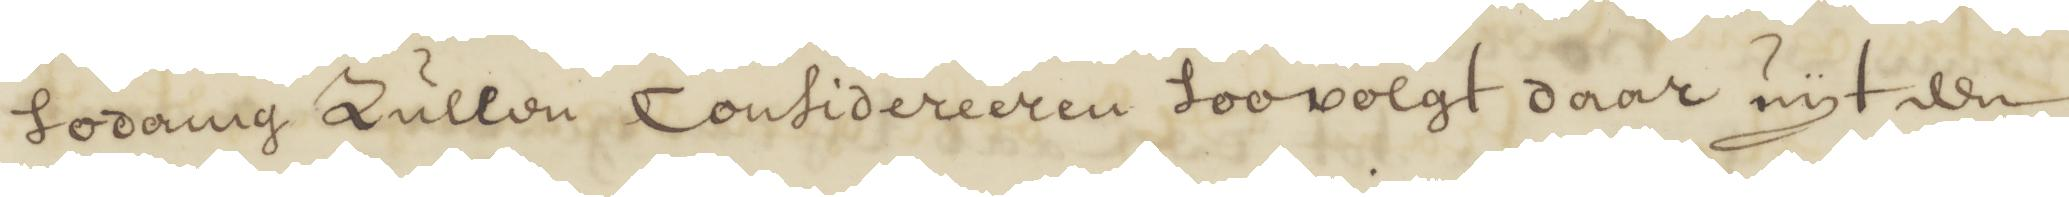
sodanig zullen Considereeren soo volgt daar uijt een
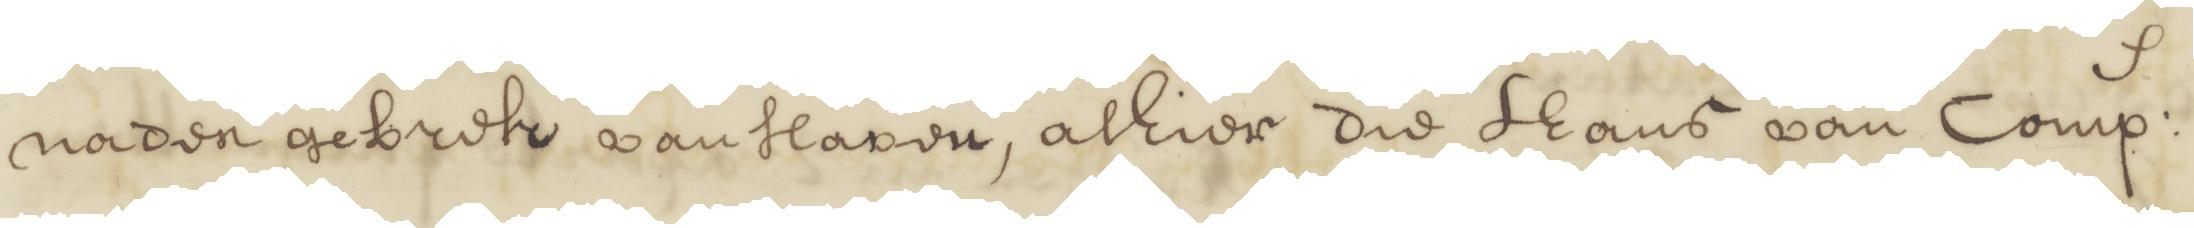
nader gebrek van slaven, alhier die thans van Comp:s
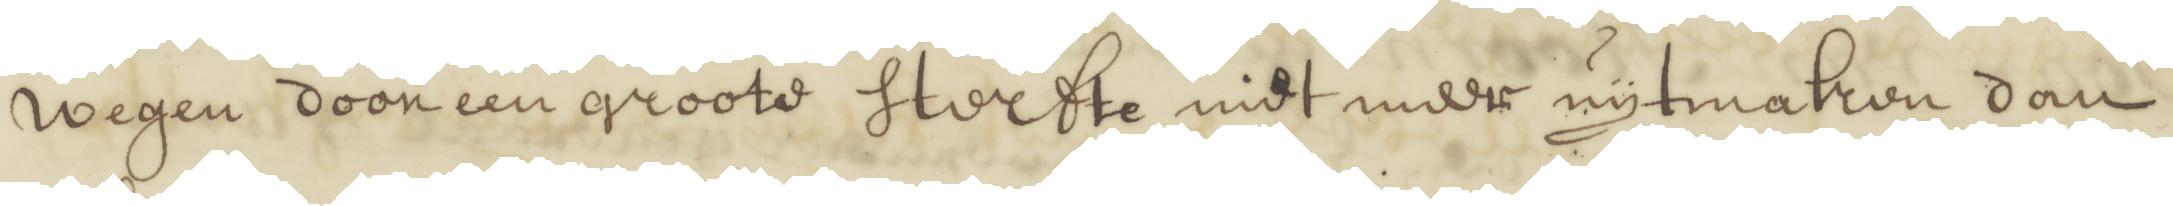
wegen door een groote sterfte niet meer uijtmaken dan
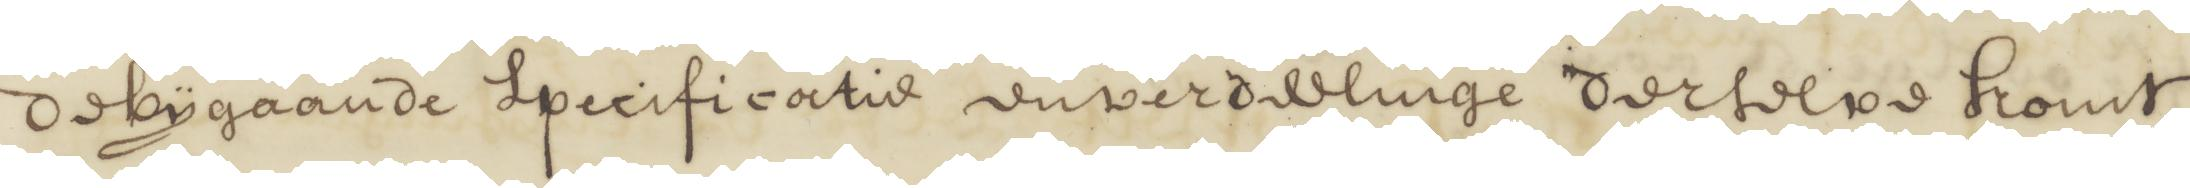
de bij gaande specificatie en verdeelinge derselve komt
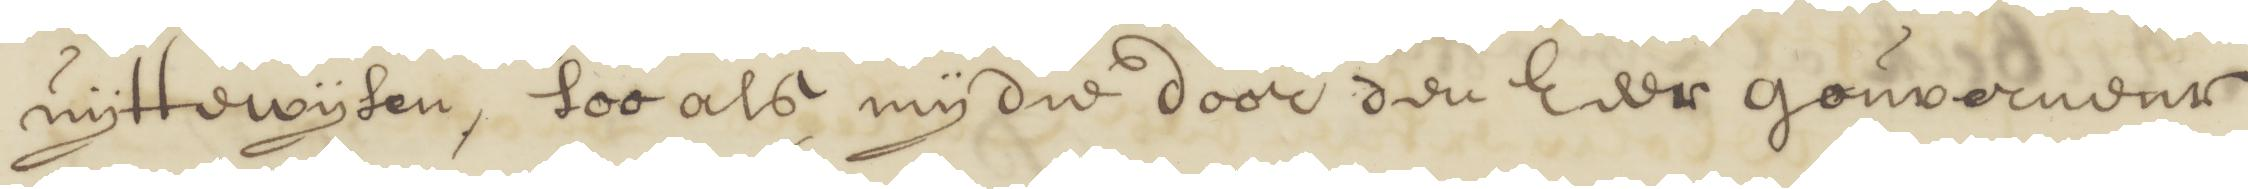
uijttewijsen, soo als mij die door den heer gouverneur
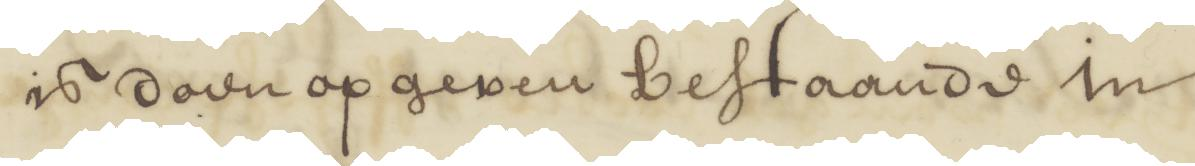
is doen op geven bestaande in
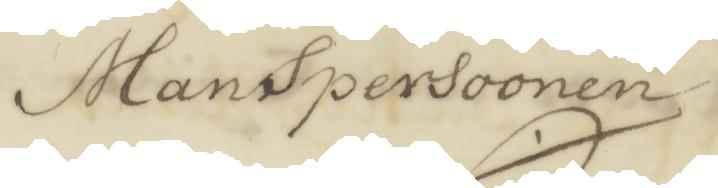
Manspersoonen
